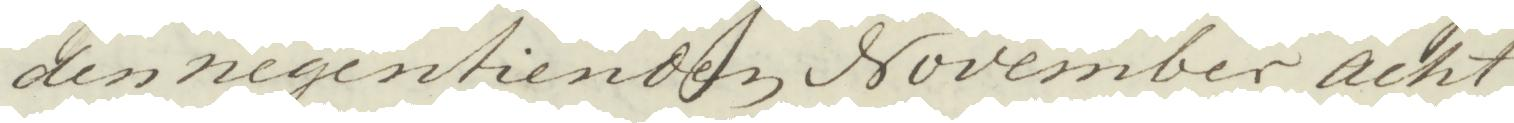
den negentienden November acht
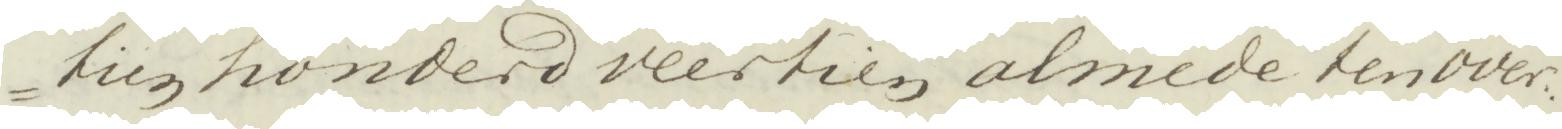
=tien honderd veertien almede ten over„
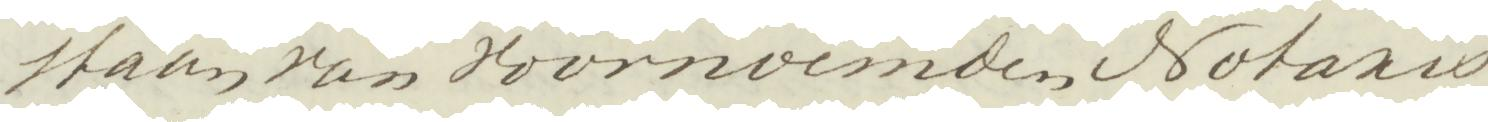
staan van voornoemden Notaris
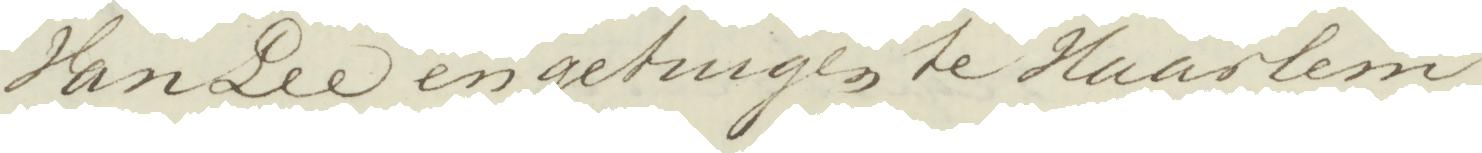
van Lee en getuigen te Haarlem
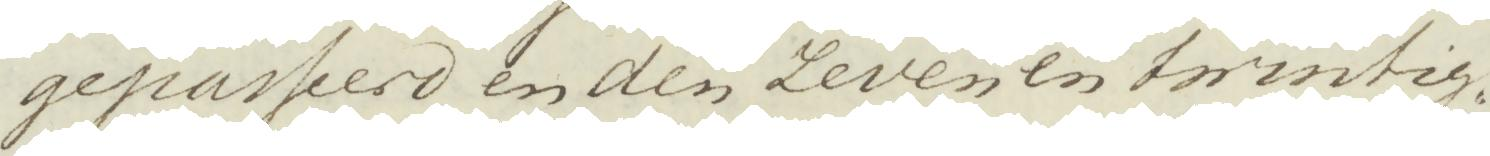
gepasseerd en den Zeven en twintig„
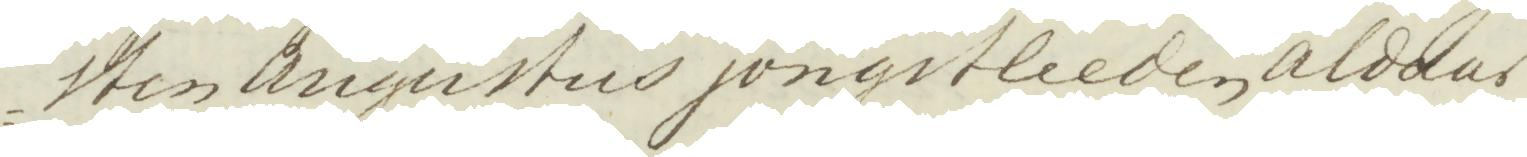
=sten Augustus jongstleeden aldaar
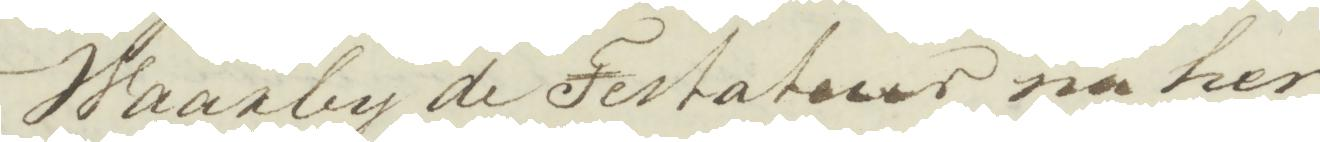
Waarbij de Testateur na her
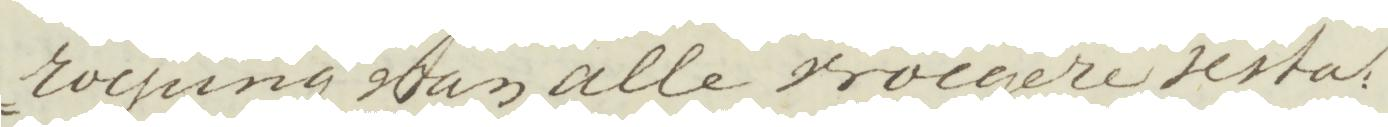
=roeping van alle vroegere Testa„
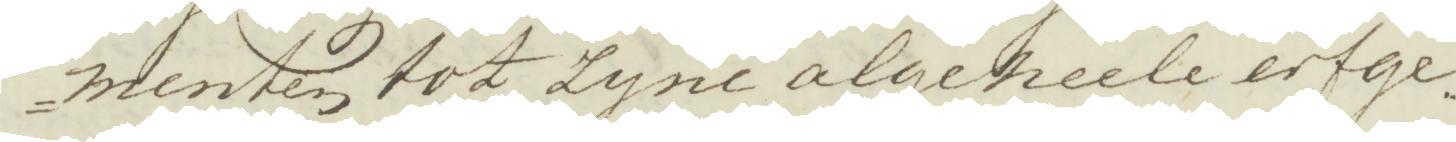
=menten tot Zyne algeheele erfge„
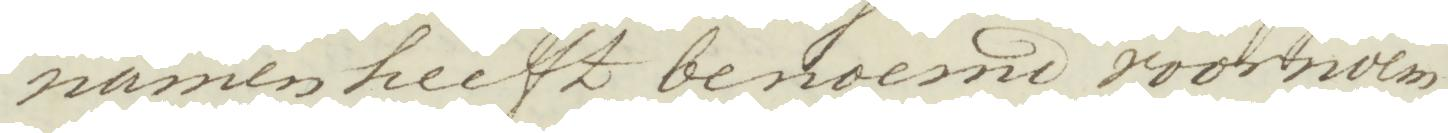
namen heeft benoemd voornoem
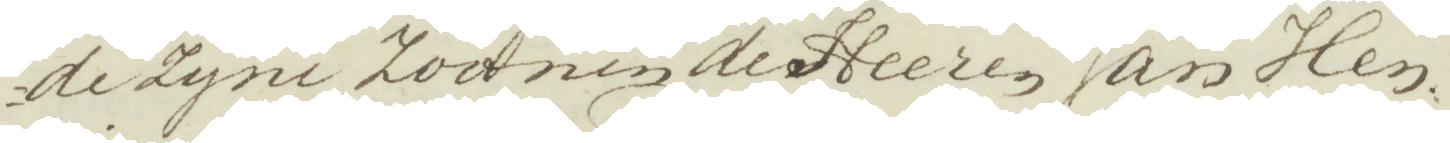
=de Zyne Zoonen de Heeren Jan Hen„
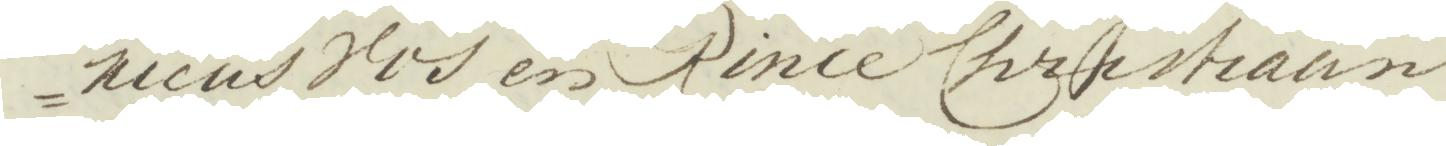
=ricus Vos en Rince Christiaan
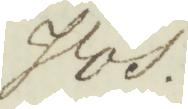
Vos.
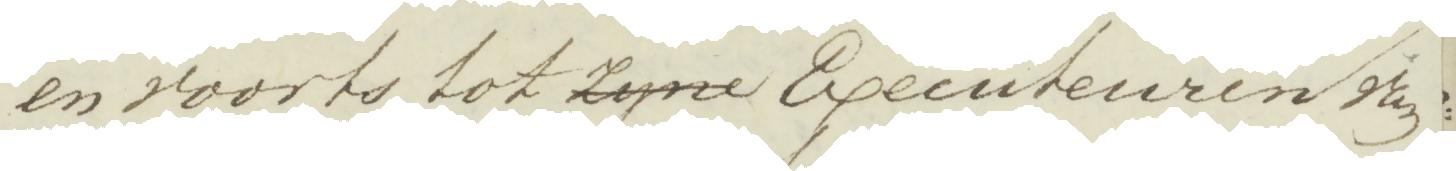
en voorts tot zyne Executeuren van
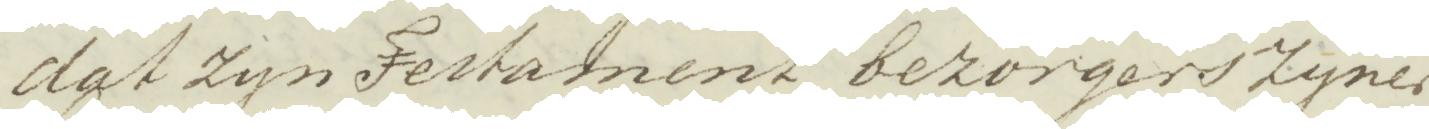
dat zyn Testament, bezorgers Zyner
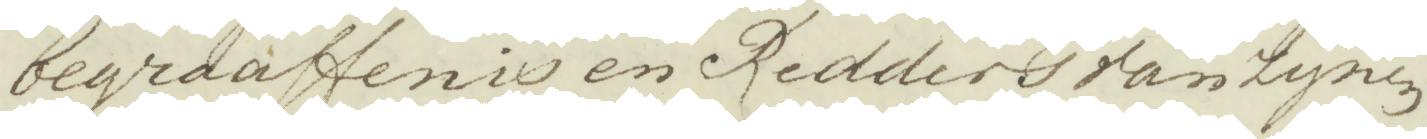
begraaffenis en Redders van Zynen
